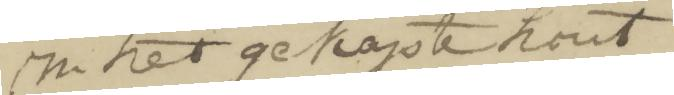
om het gekapte hout
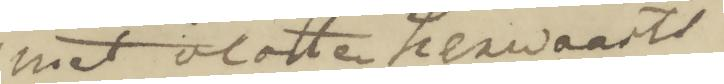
met vlotte herwaarts
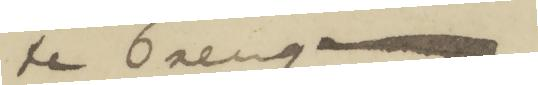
te brenge
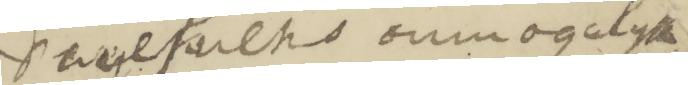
d wyl sulks onmogelyk
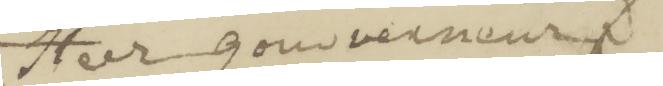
Heer gouverneur ver
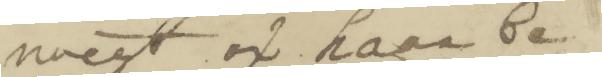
noegt over haar be
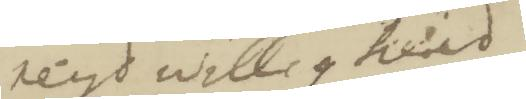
reijd willig heid
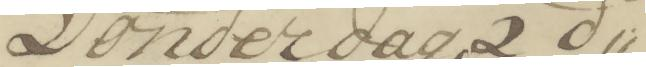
Donderdag„ 2 d„o
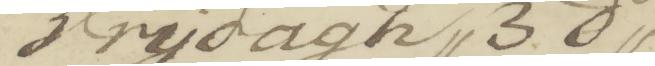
Vrijdagh„ 3 d„o
